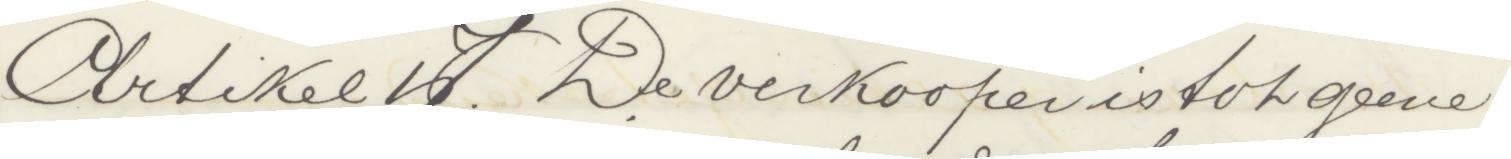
Artikel 18. De verkooper is tot geene
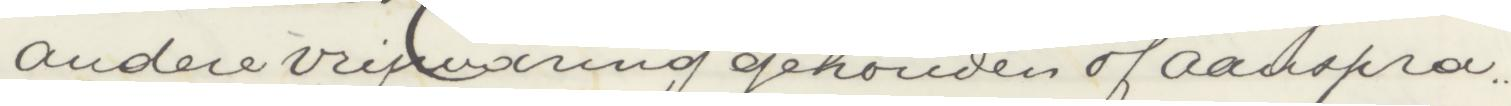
andere vrijwaring gehouden of aanspra„
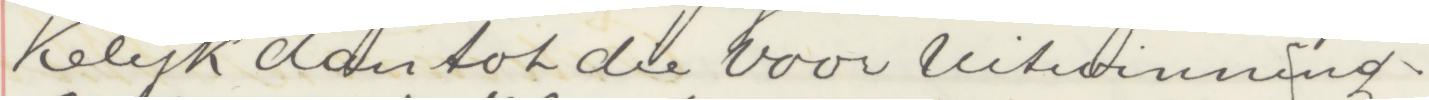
kelijk dan tot die voor uitwinning.
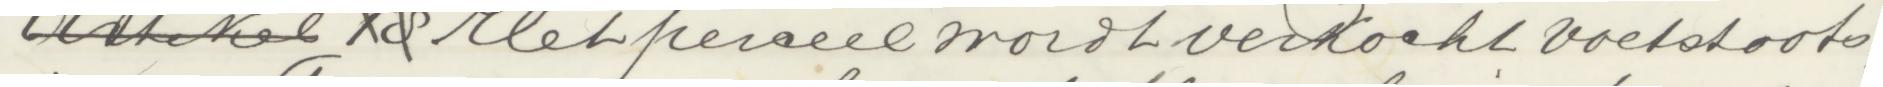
Artikel 18 Het perceel wordt verkocht voetstoots,
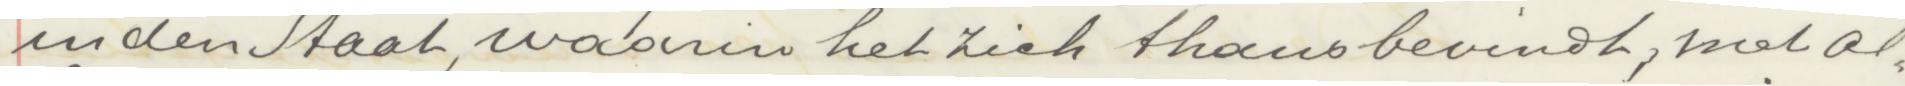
in den staat, waarin het zich thans bevindt, met al„
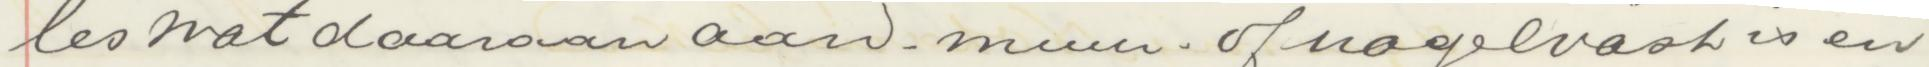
les wat daaraan aard- muur- of nagelvast is en
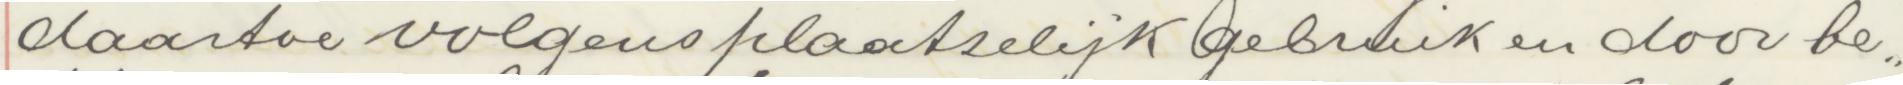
daartoe volgens plaatselijk gebruik en door be„
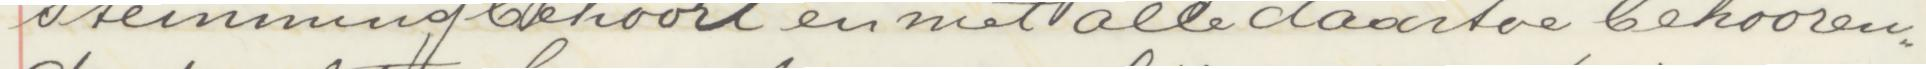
stemming behoort en met alle daartoe behooren„
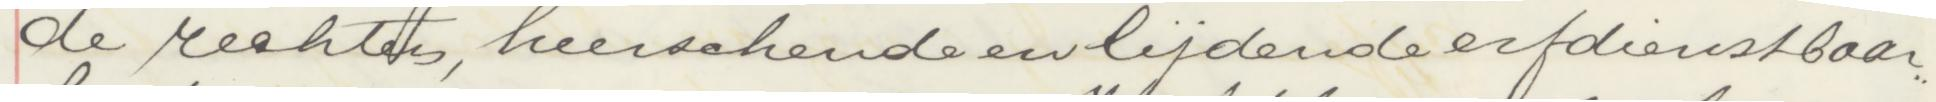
de rechten, heerschende en lijdende erfdienstbaar„
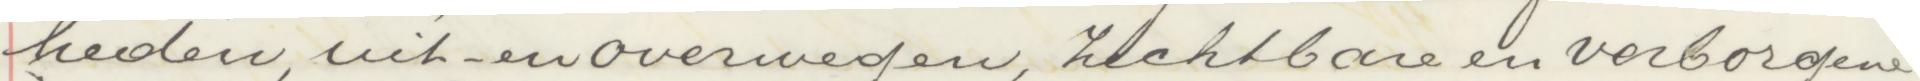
heeden, uit- en overwegen, zichtbare en verborgen
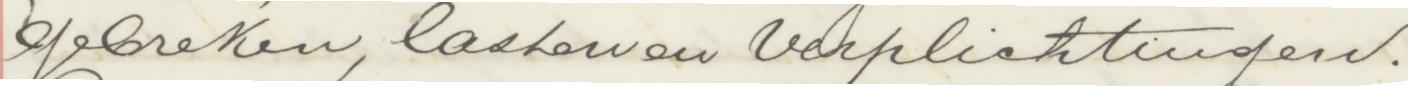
gebreken, lasten en verplichtingen.
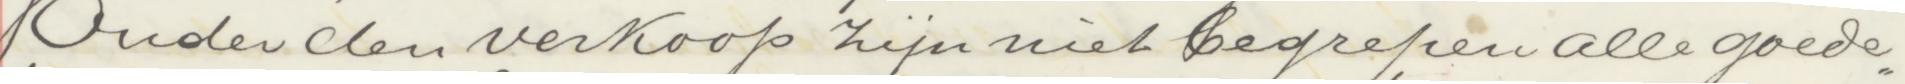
Onder den verkoop zijn niet begrepen alle goede„
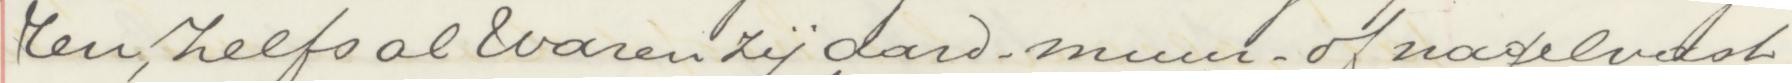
ren, zelfs al waren zij aard- muur- of nagelvast,
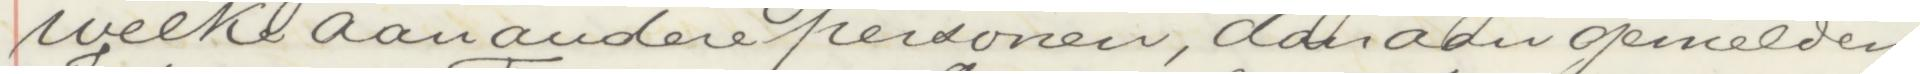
welke aan andere personen, dan aan gemelden
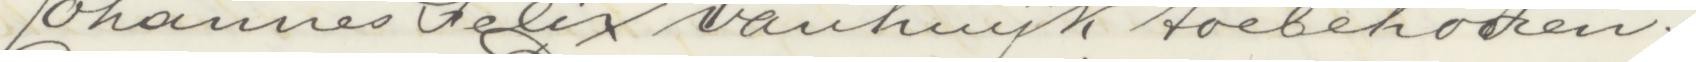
Johannes Felix van Luijk toebehoren.
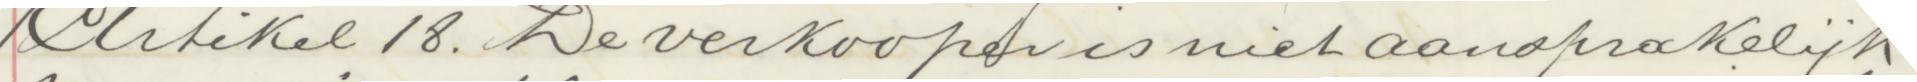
Artikel 18. De verkooper is niet aansprakelijk
